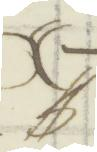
H
